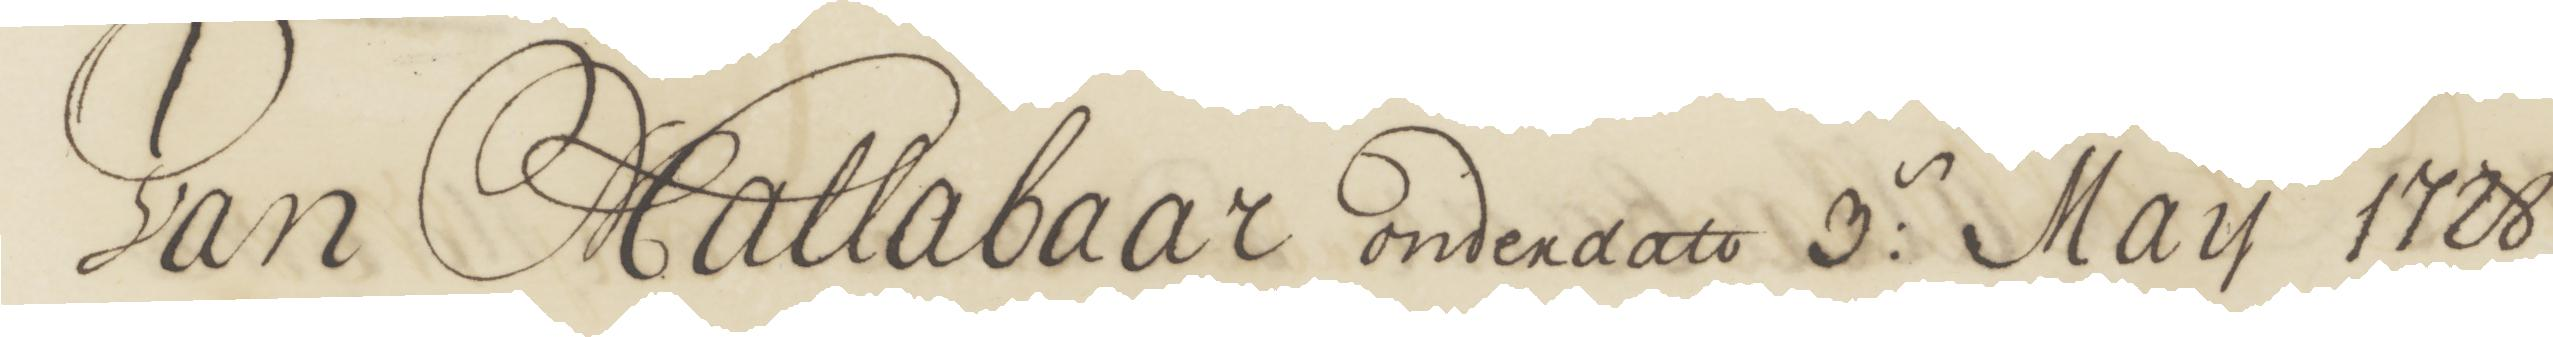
Van Mallabaar onder dato 3:' Maij 1728
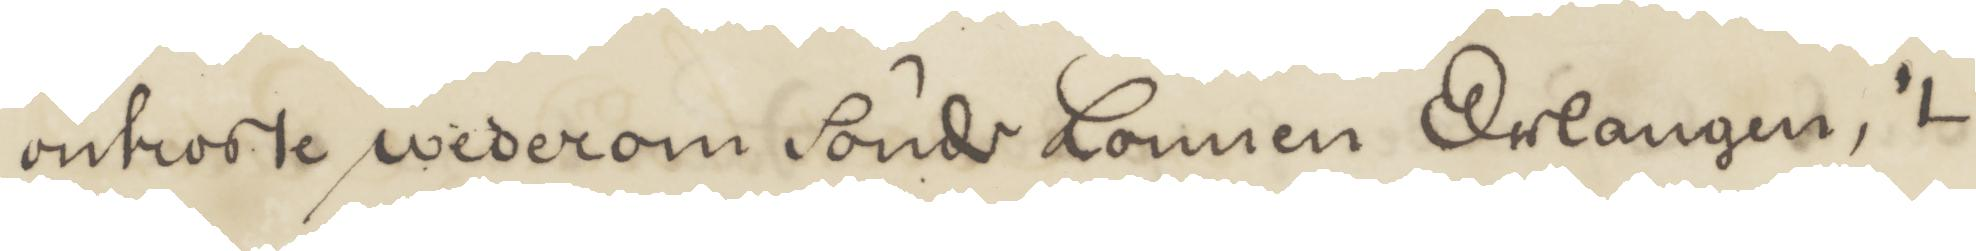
onkoste wederom soude konnen Erlangen, ’t
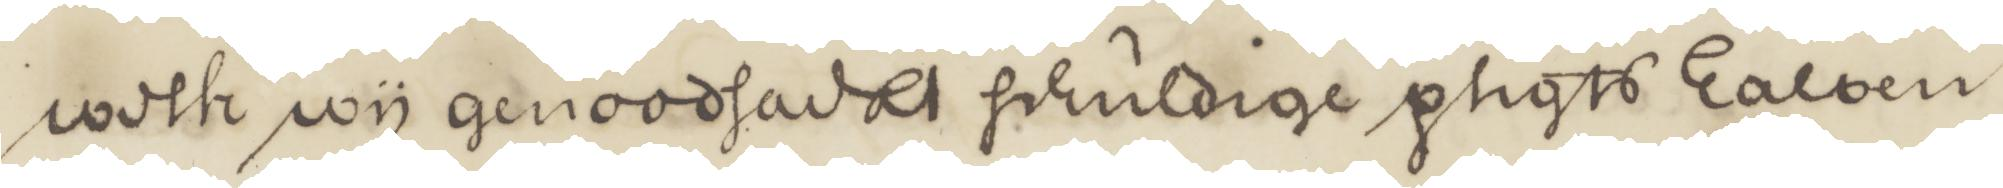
welk wij genoodsaekt schuldige pligts halven
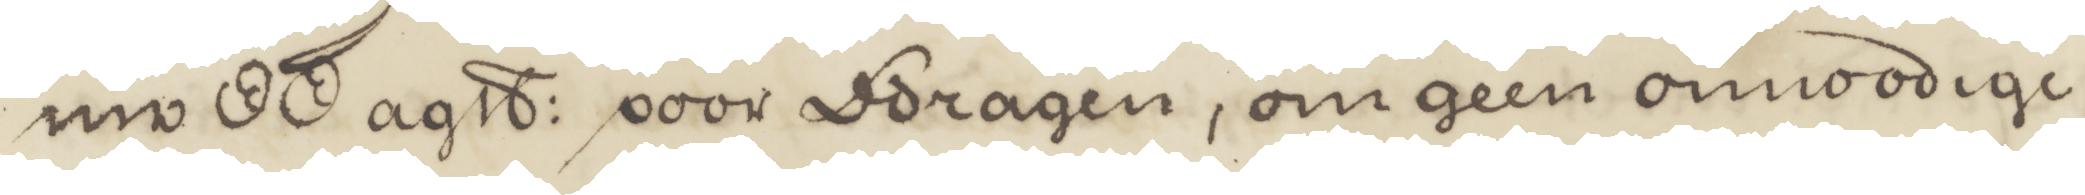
uw EE agtb: voor tedragen, om geen onnoodige
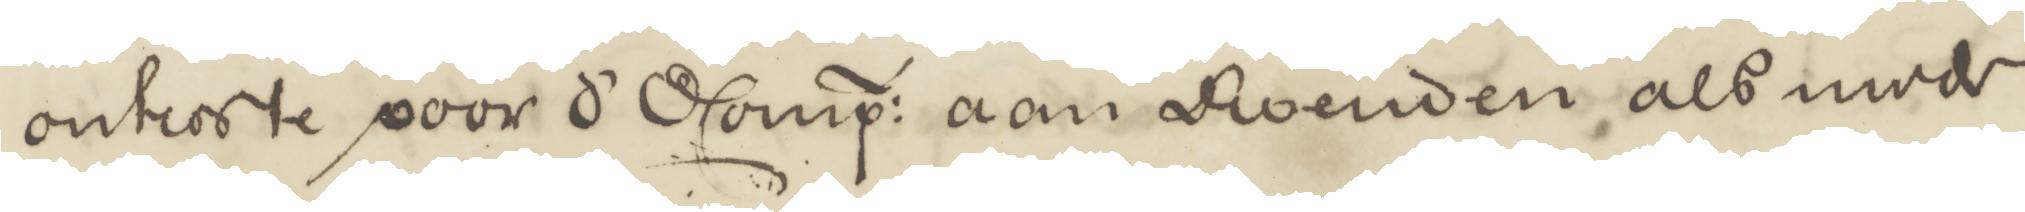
onkoste voor d’ EComp: aan te wenden als mede
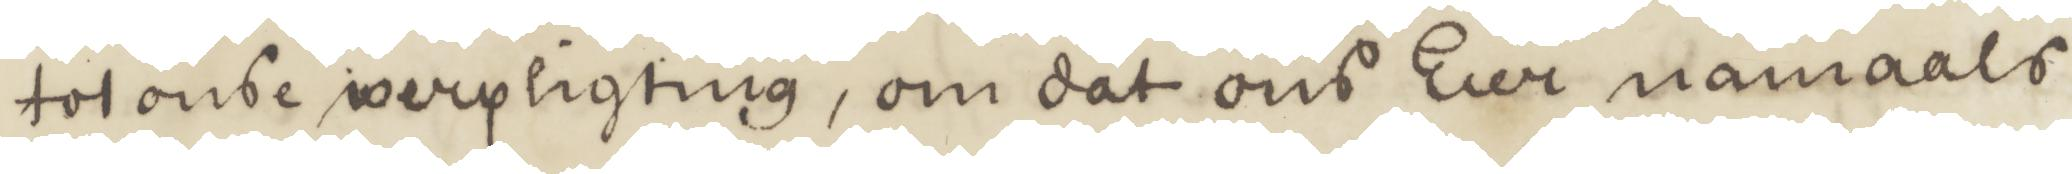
tot onse verpligting, om dat ons hier namaals
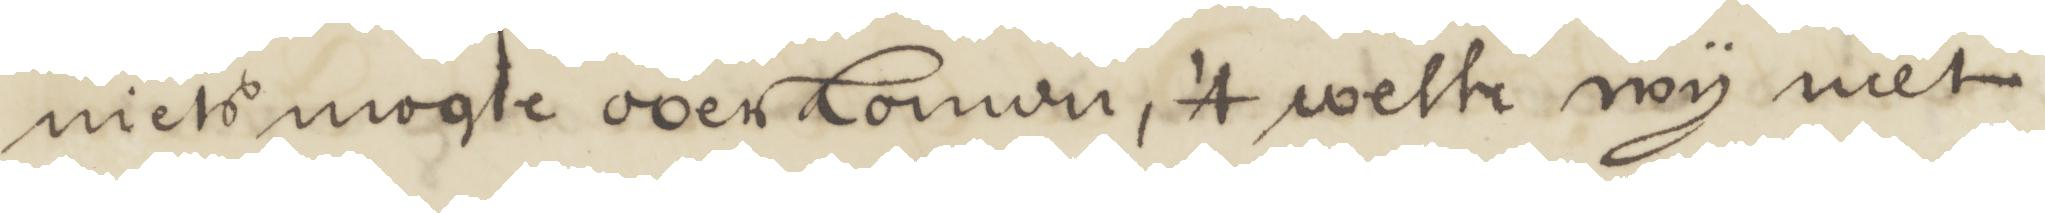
niets mogte overkomen, ’t welk wij niet
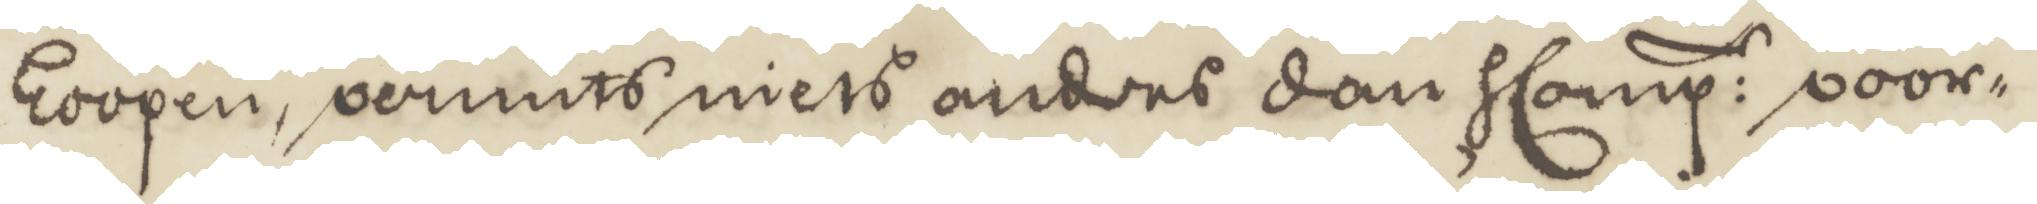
hoopen, vermits niets anders dan 'sComp:s voor„
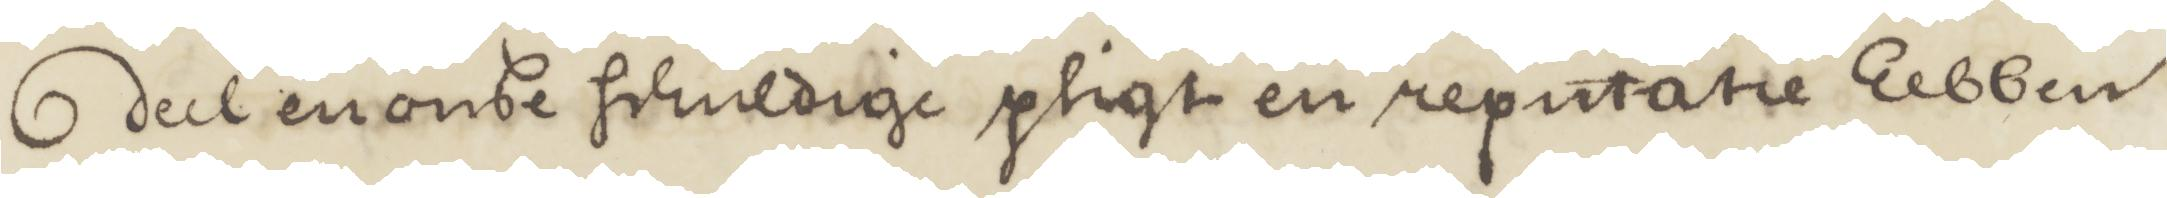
deel en onse schuldige pligt en reputatie hebben
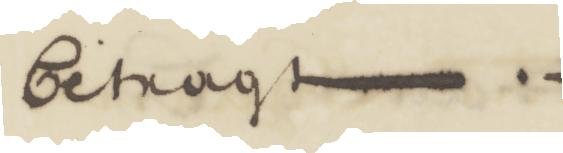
betragt.
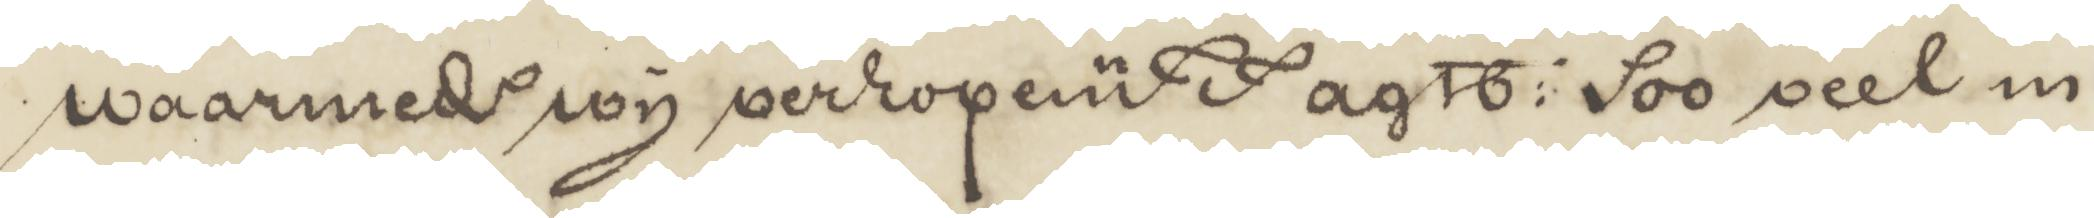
waarmede wij verhopenuEE agtb: soo veel in
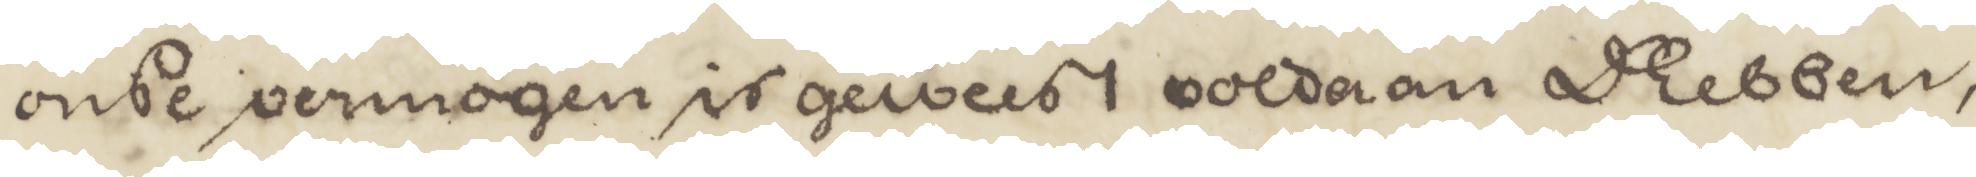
onse vermogen is geweest voldaan te hebben,
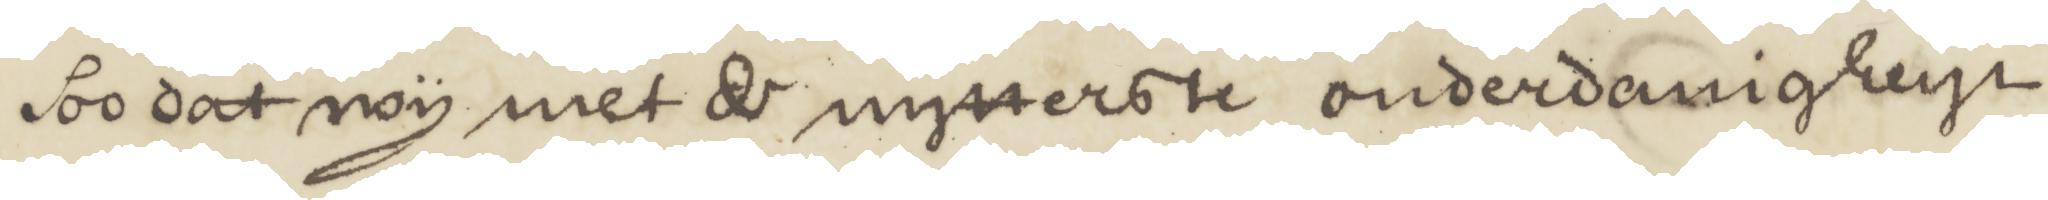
soo dat wij met de uijtterste onderdanigheijt
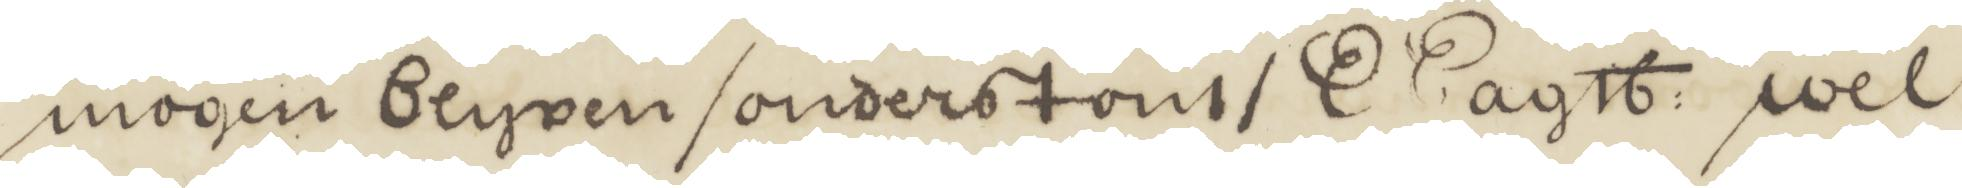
mogen blyven / onderstont / E E agtb: wel
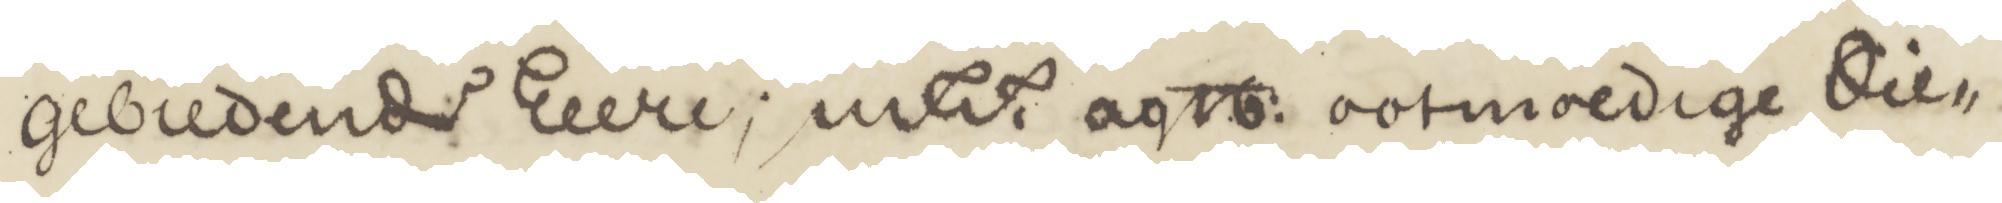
gebiedende heere; uEE: agtb: ootmoedige die„
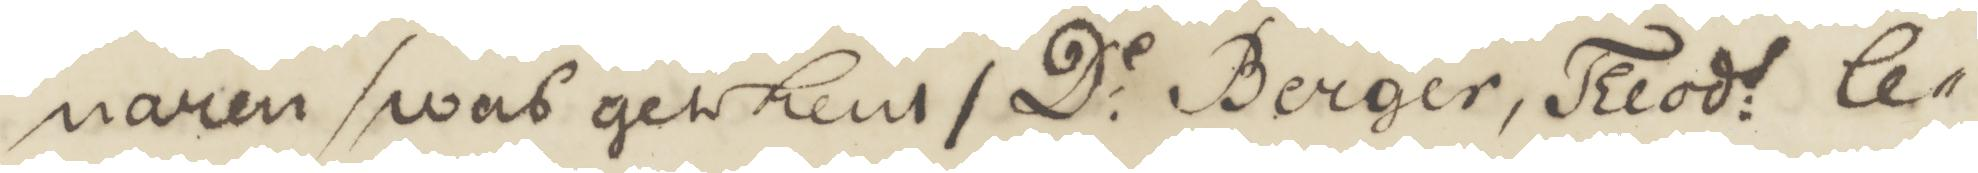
naren / was getekent / D:l Berger, Theod:s le„
